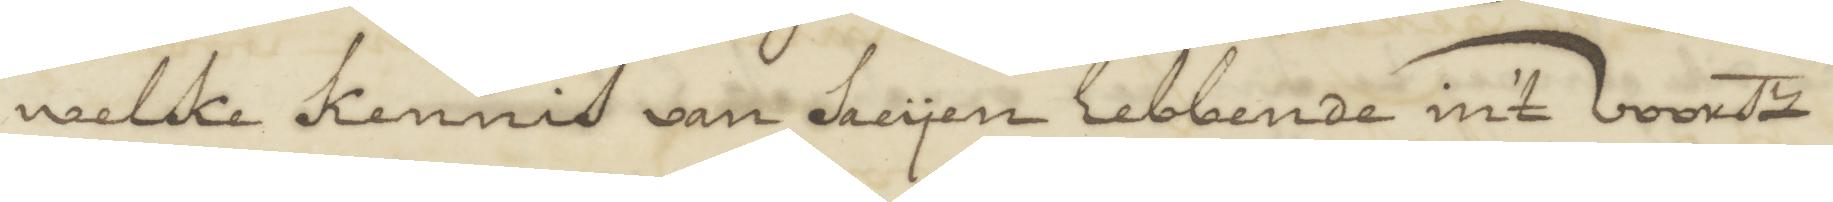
welke kennis van saeijen hebbende in’t voorsz
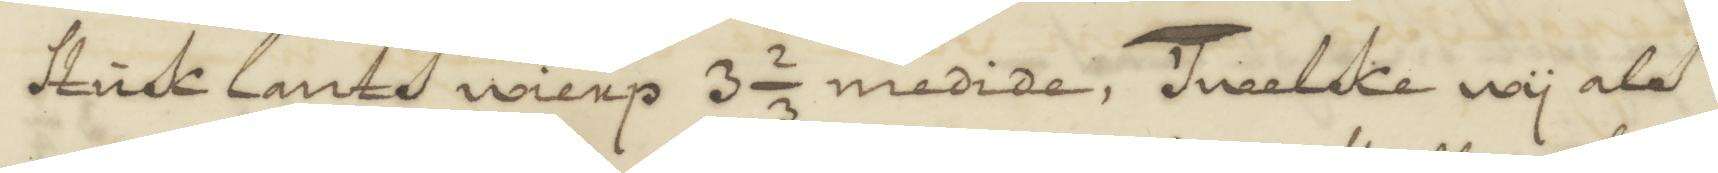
stuk lants wierp 3 2/3 medide, 'Twelke wij als
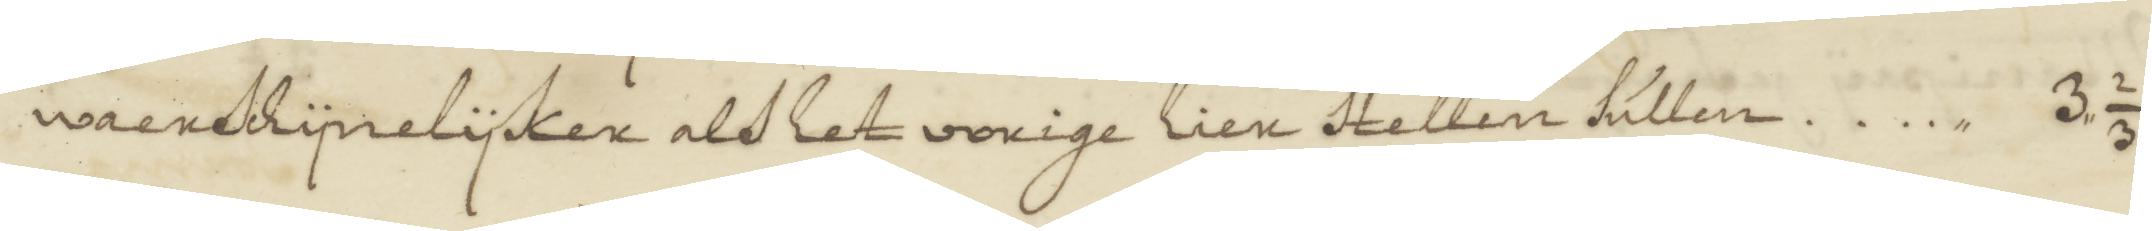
waerschijnelijker als het vorige hier stellen sullen . . . . „ 3„2/3
